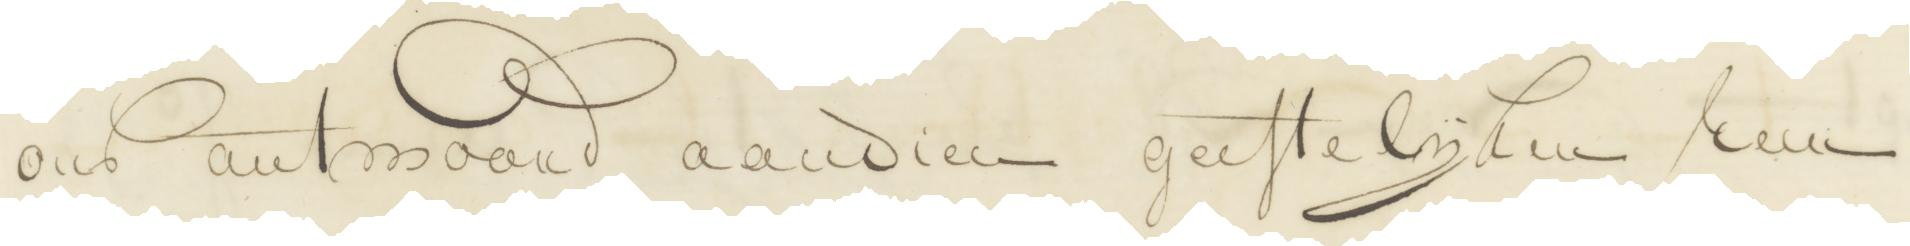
ons antwoord aandien geestelijken heer
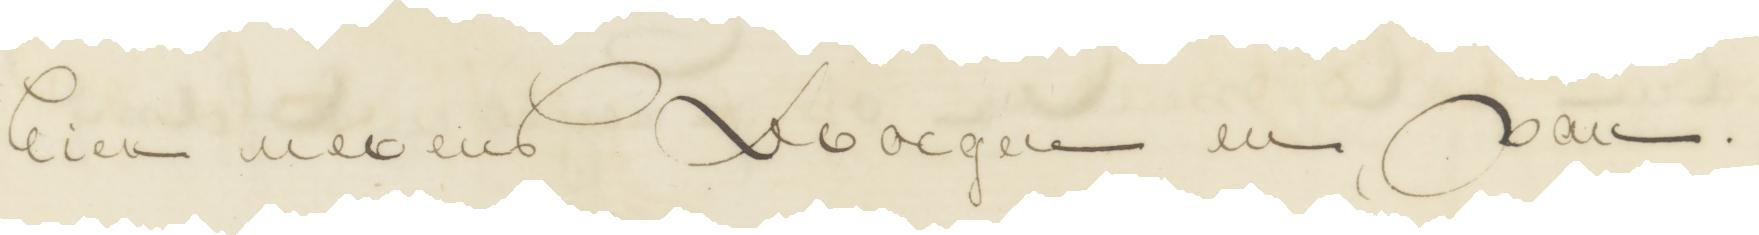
hier nevens tevoegen en van.
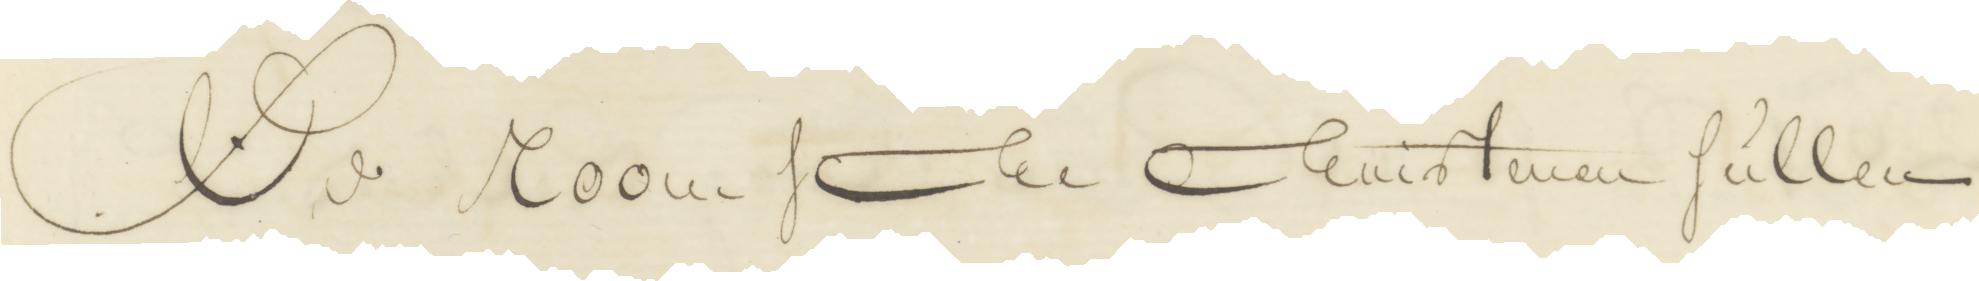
De roomsche christenen sullen
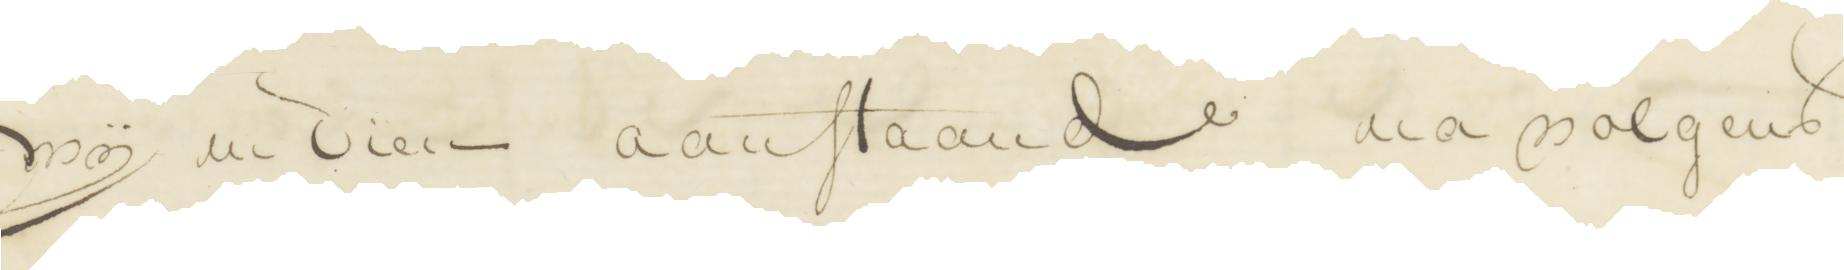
wij en dien aanstaande na volgens
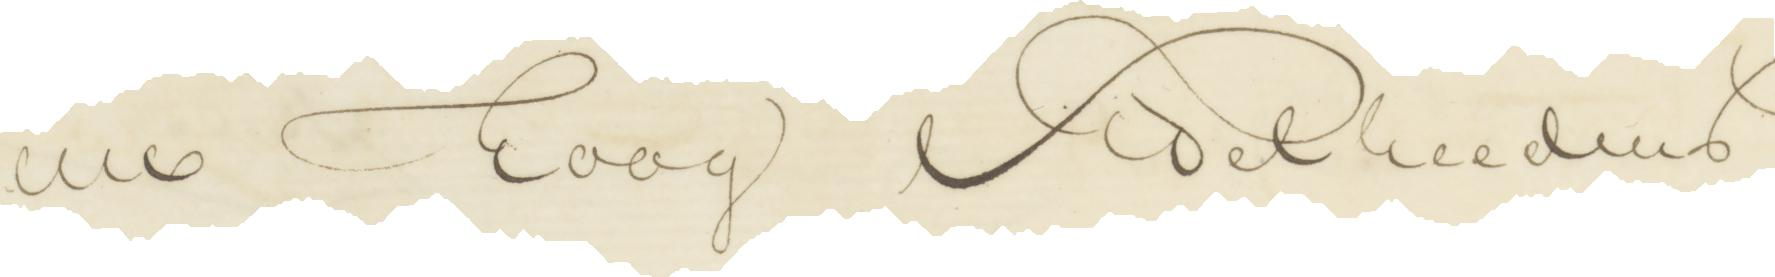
uw hoog Edelheedens
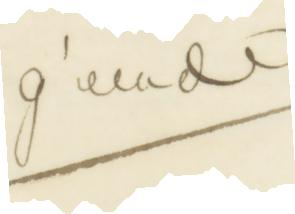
g'eerde
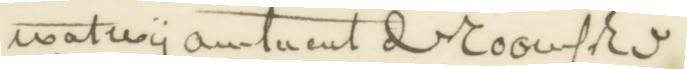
wat wij omtrent de roomsche
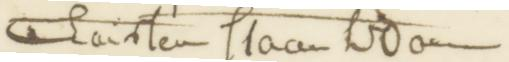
christen staan tedoen
